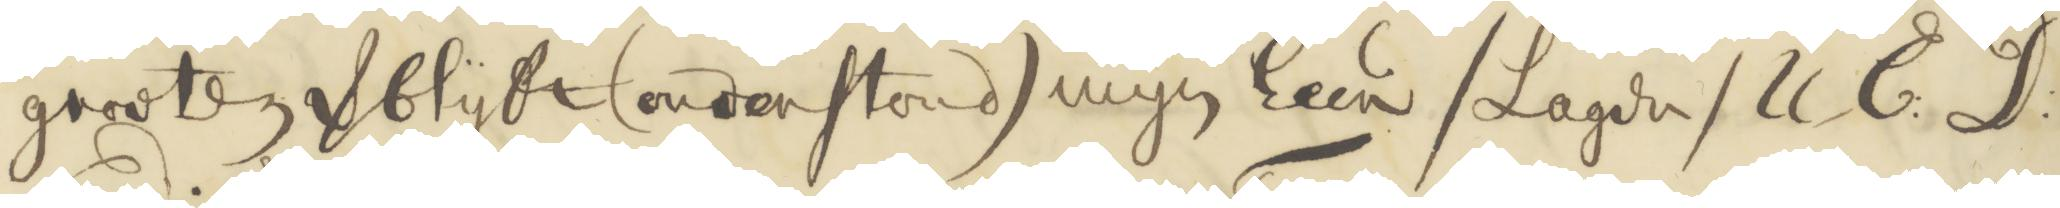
groeten verblijft (onderstond) mijn heer /Lager/ UE: D:
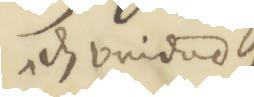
^en vriend
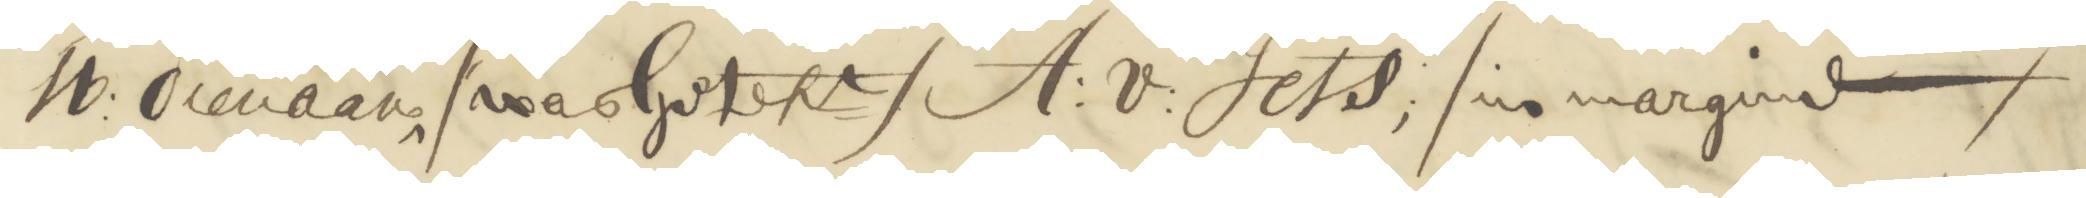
w: dienaar ^ /was Getek=t/ A: v: Tets; /in margine/
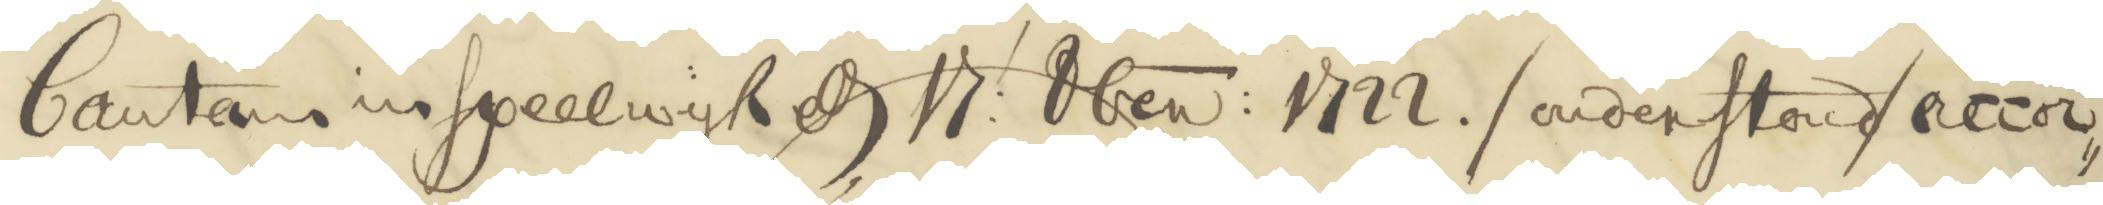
Bantam in speelwijk den 17:' 8ber: 1722. /onderstond/ accor„
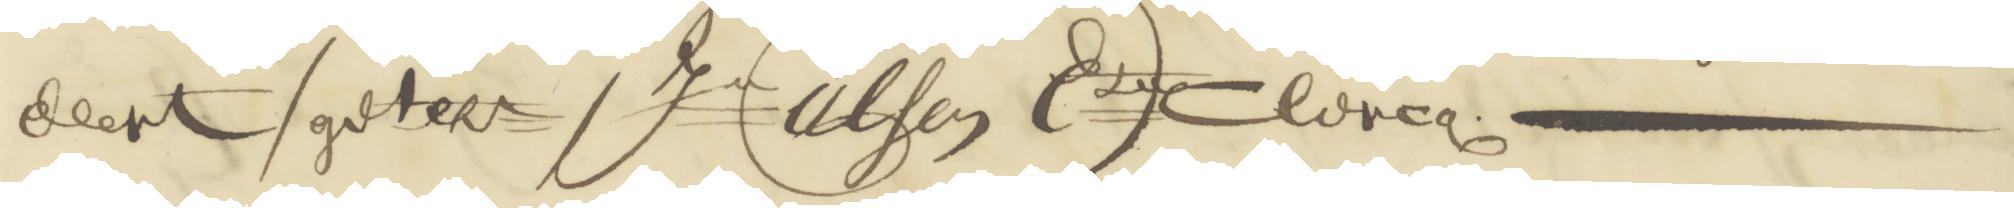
deert /getek=t/ J=n ulsen E=te clercq. —
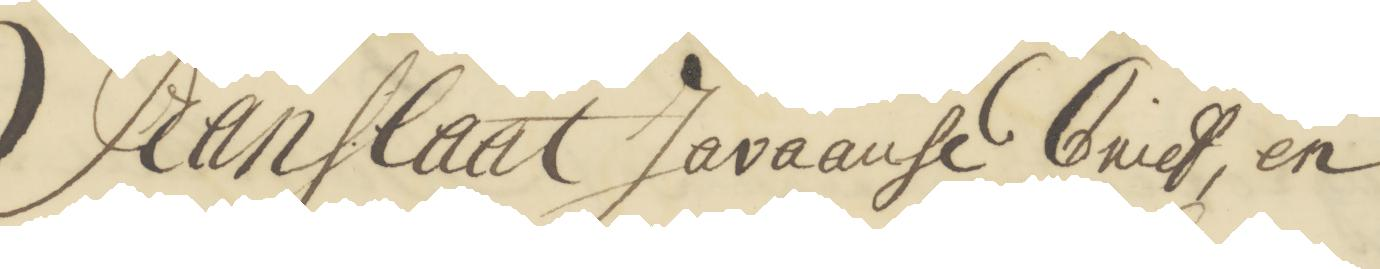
Translaat Javaanse brief, en
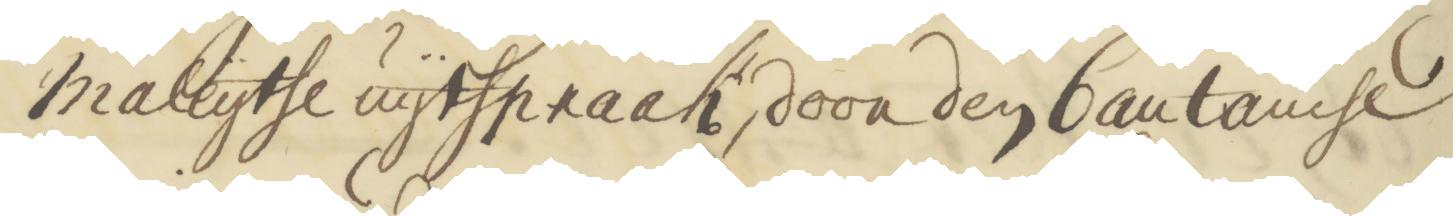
maleijtse uijtspraak, door den bantamse
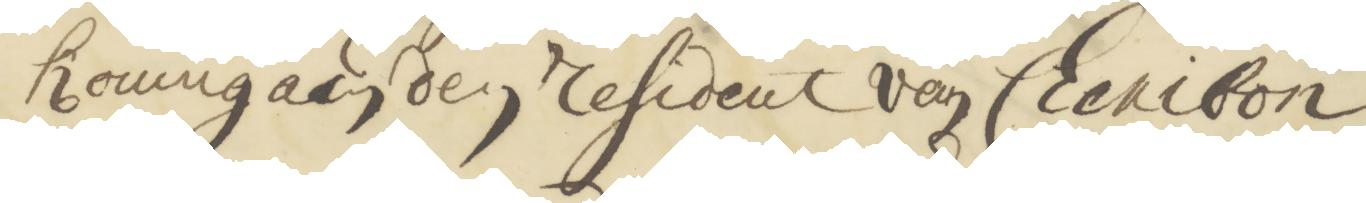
koning aen den resident van Cheribon
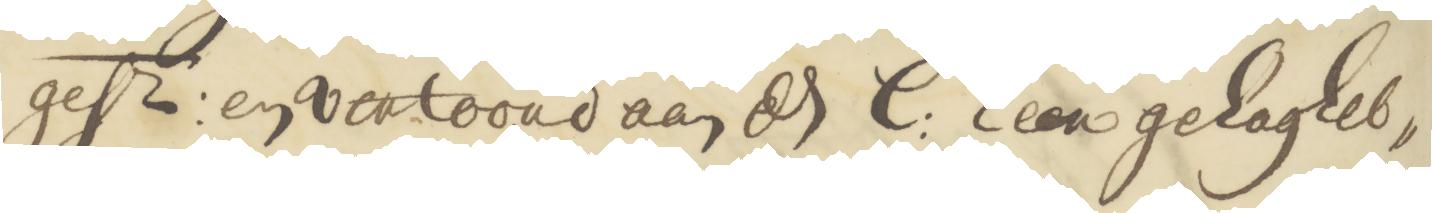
gesz: en vertoond aan den E: heer gezagheb„
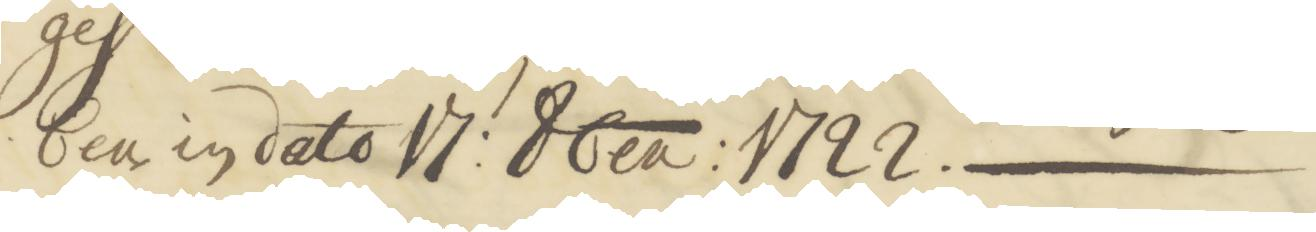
ber in dato 17:' 8ber: 1722. —
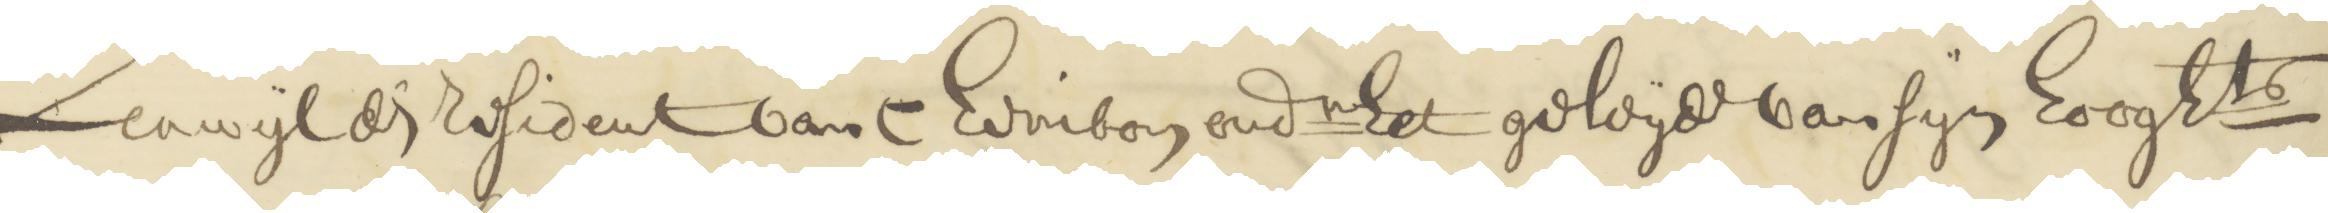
Terwijl den resident van cheribon ond=r het geleijde van sijn hoogh=ts
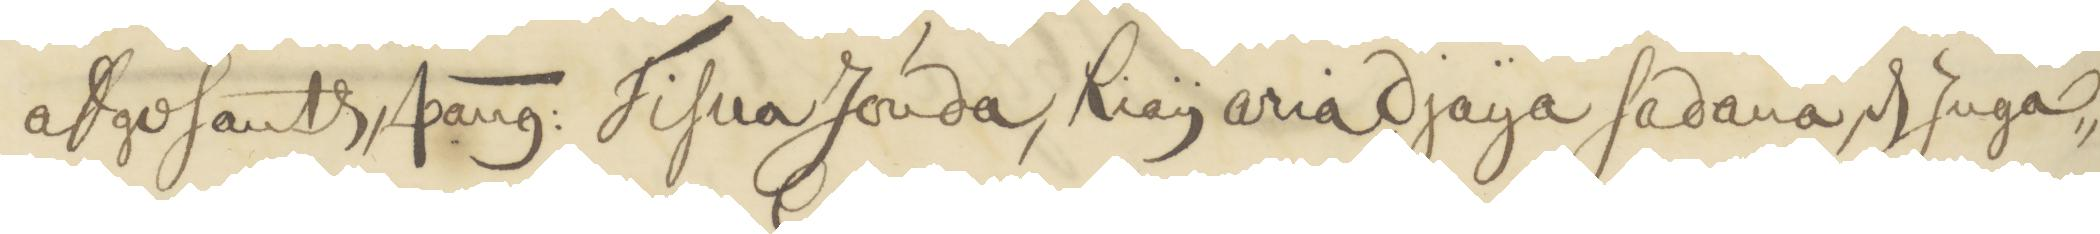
afgesanten, pang: Tisua Jouda, kiaij aria djaija sadana, en Jnga„
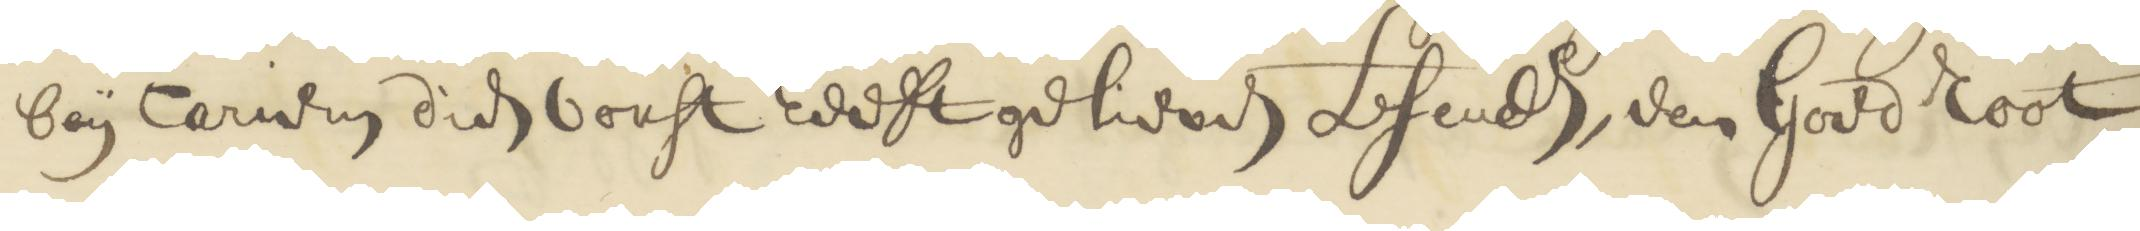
beij cariem dien vorst heeft gelieven tesenden, een Goed root
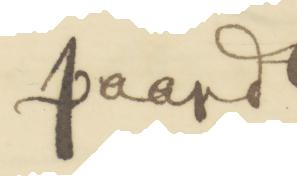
paardt
